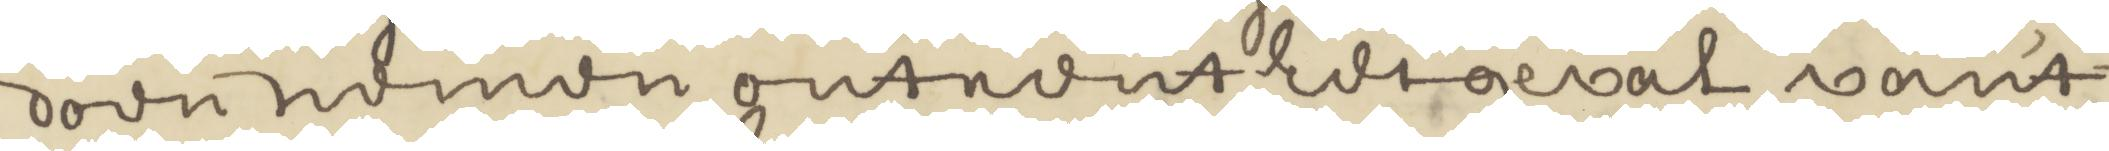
doen nemen ontrent het geval van’t
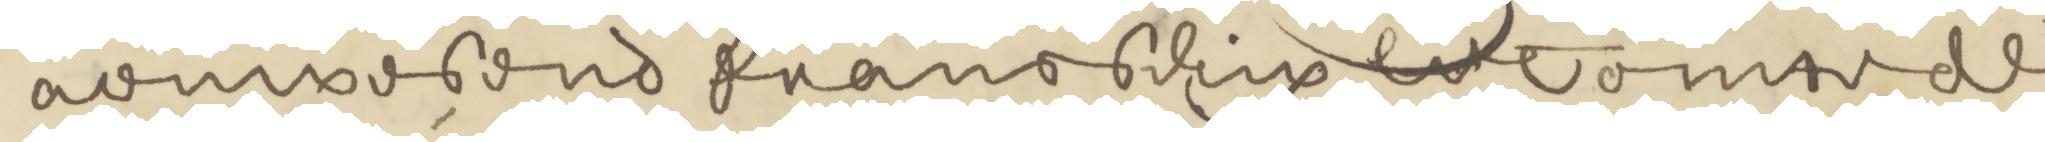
aenwesend fransschip lecomte de
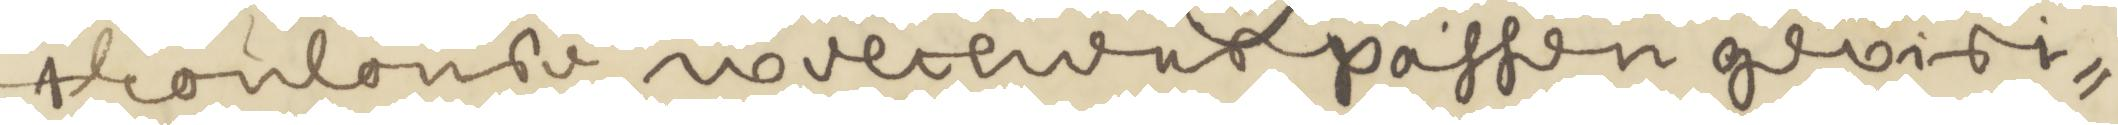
thoulouse welckers passen gevisi„
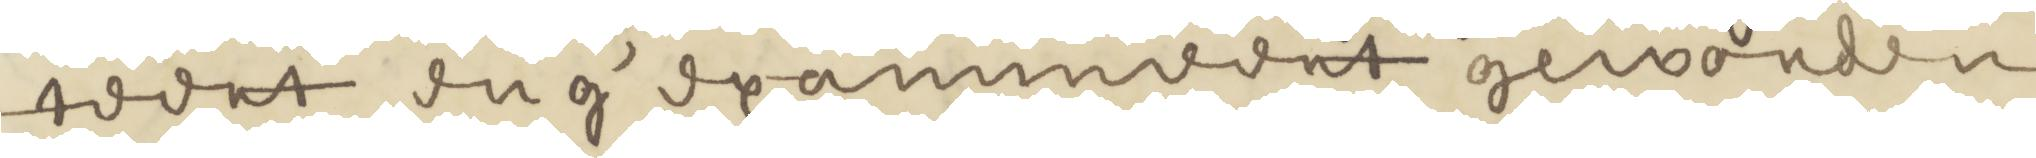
teert en g’ examineert geworden
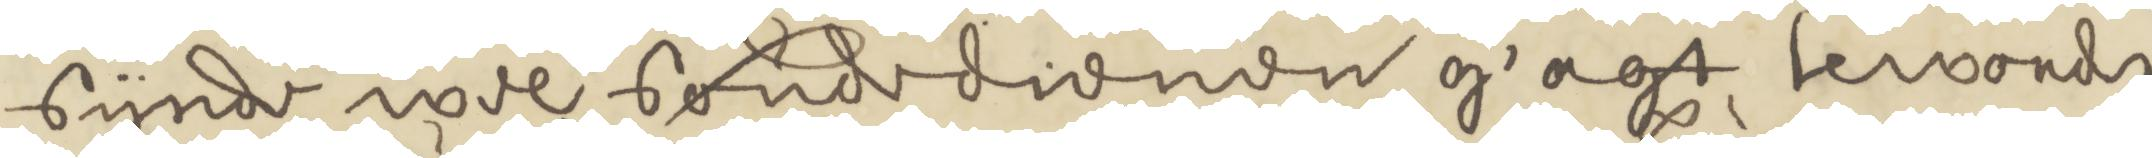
sijnde wel soude dienen g’agt te worden
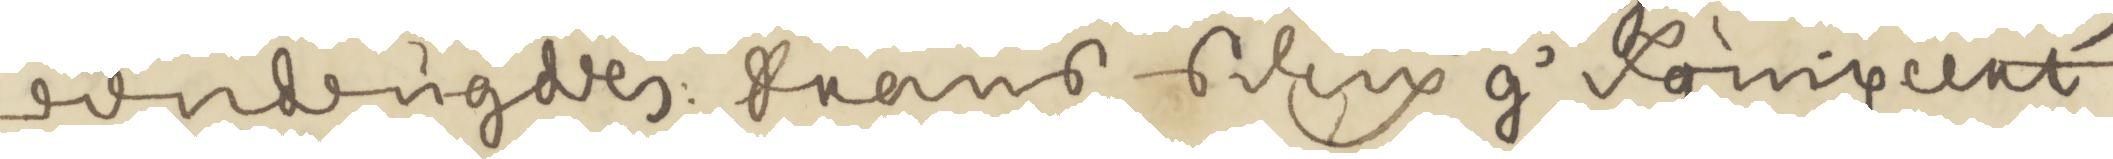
eendeugdelijk frans schip g’ Equipeert
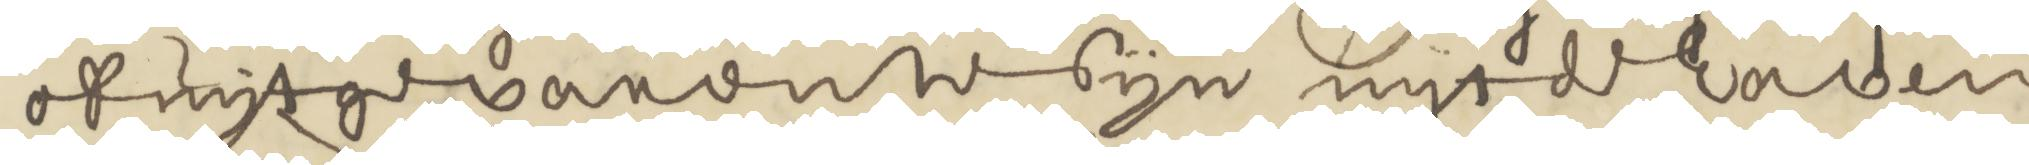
of uijt gevaren te sijn uijt de haven
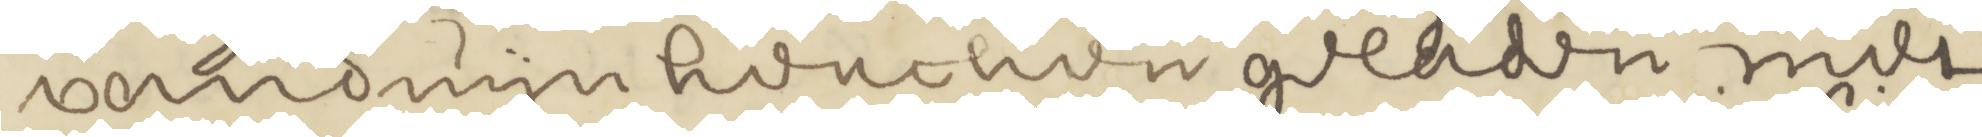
van duijn kercken geladen met
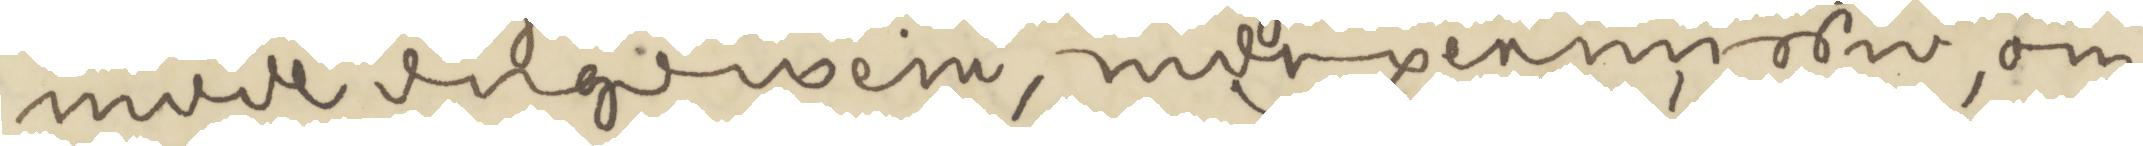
meel en geweir, met permissie, om
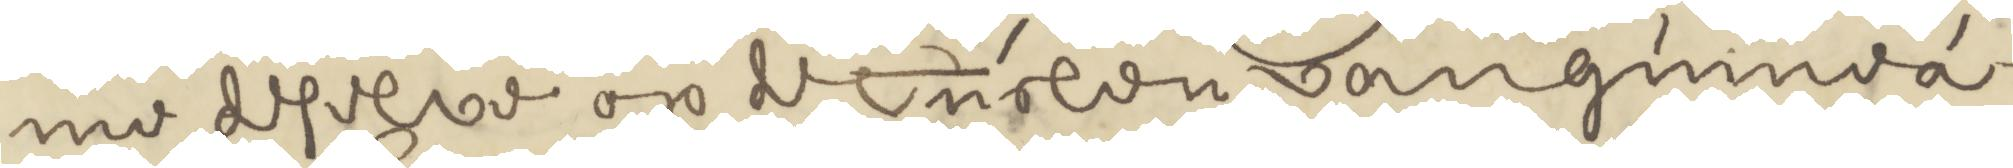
me deselve op de custen van guinea
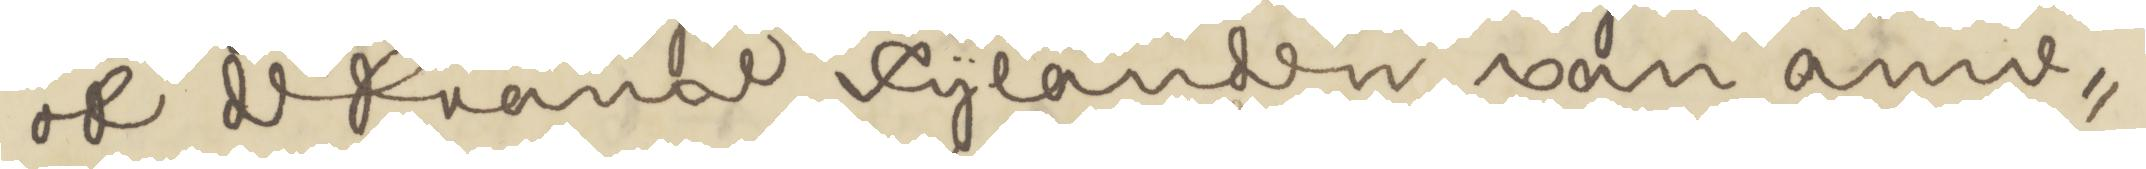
of de france Eijlanden van ame„
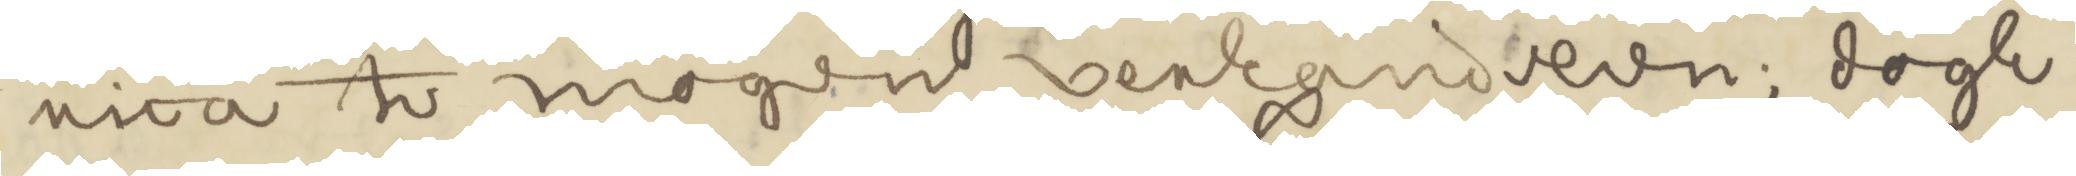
rica te mogen verhandelen; dogh
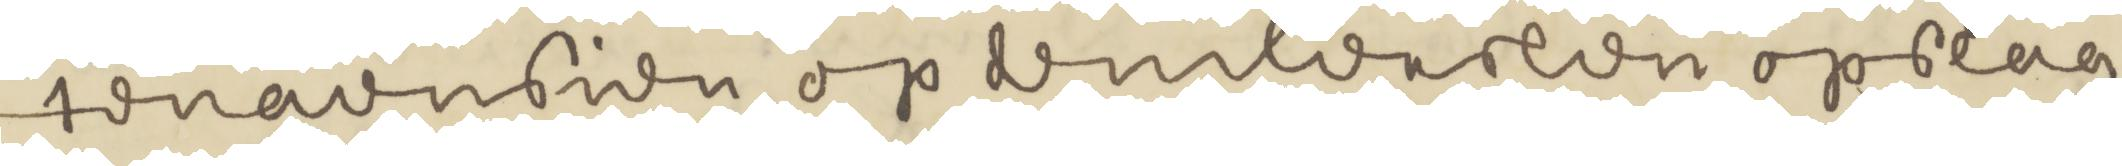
tenaensien op den Eersten opslag
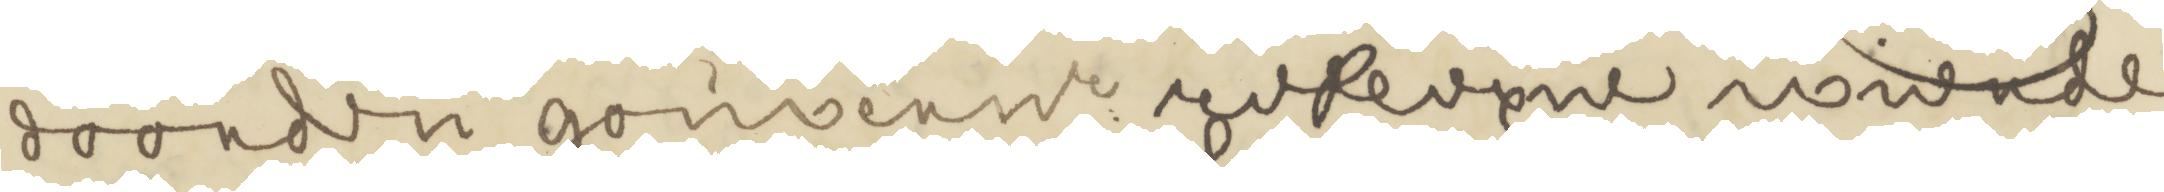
door den gouvern:r reflexie wierde
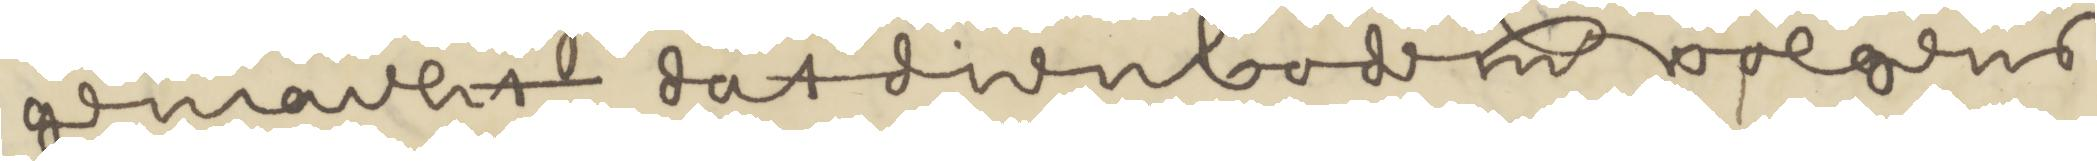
gemaekt dat dien bodem volgens
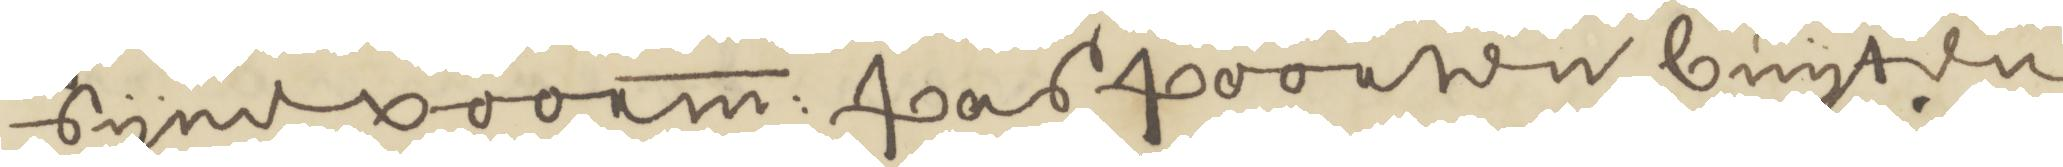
sijne voorm: paspoorten buijten
